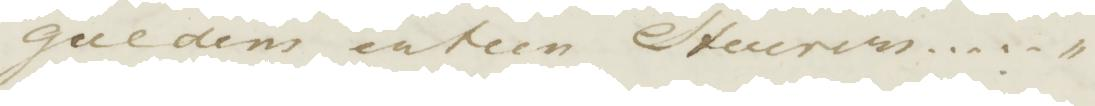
guldens en tien Stuivers - - - - - „
